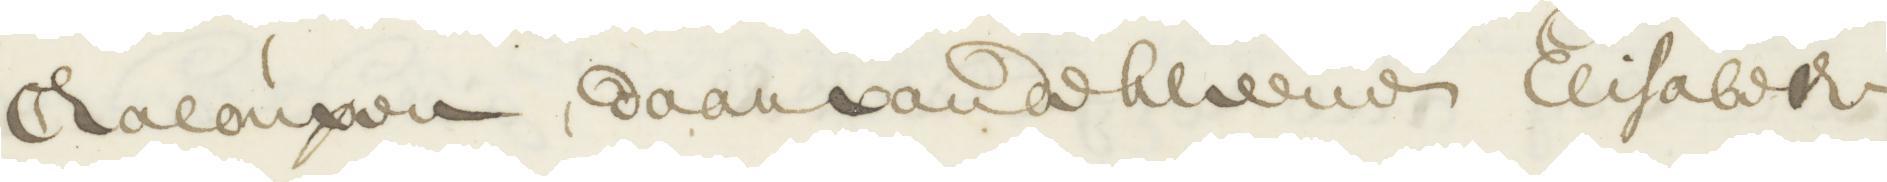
Chaloupen, daar van de kleene Elisabeth
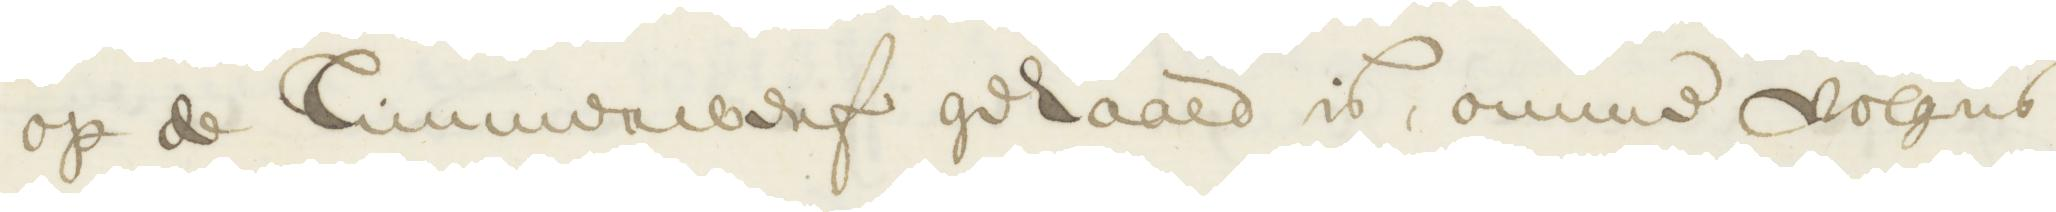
op de Timmerwerf gehaald is, omme volgens
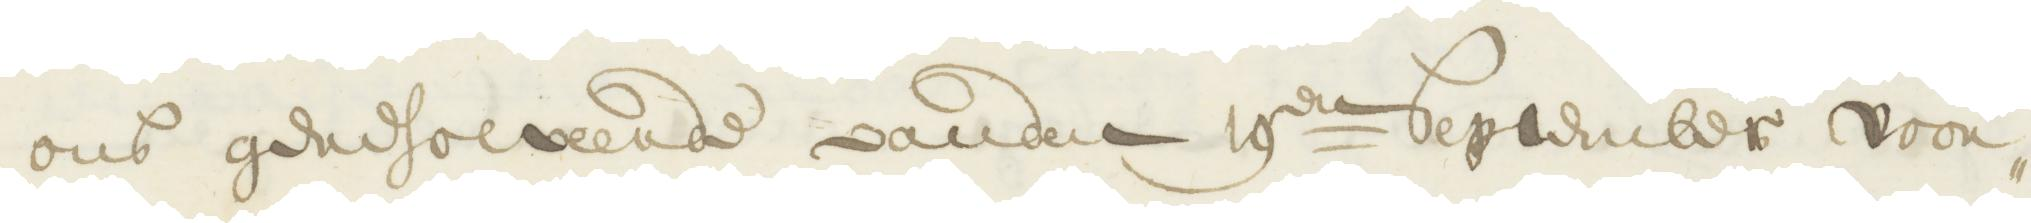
ons geresolveerde van den 19=en september voor„
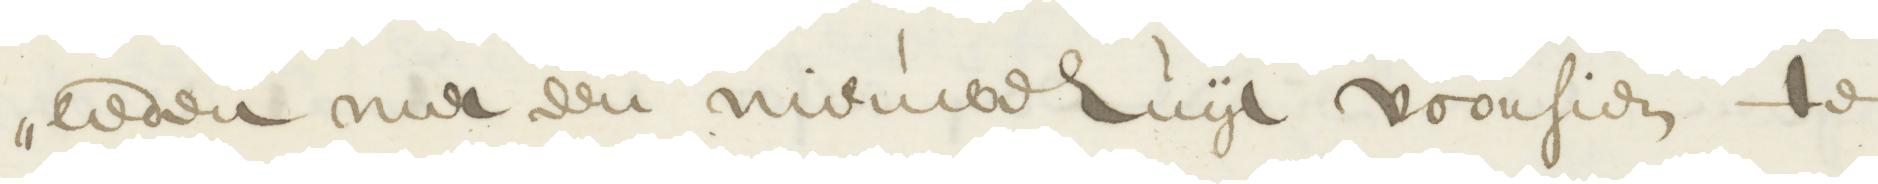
„leden met een nieuwe huijt voorsien te
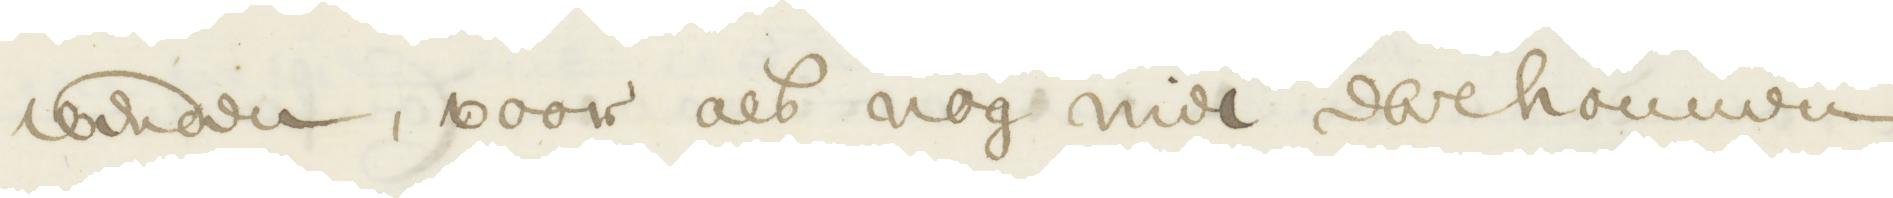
werden, voor als nog niet wel konnen
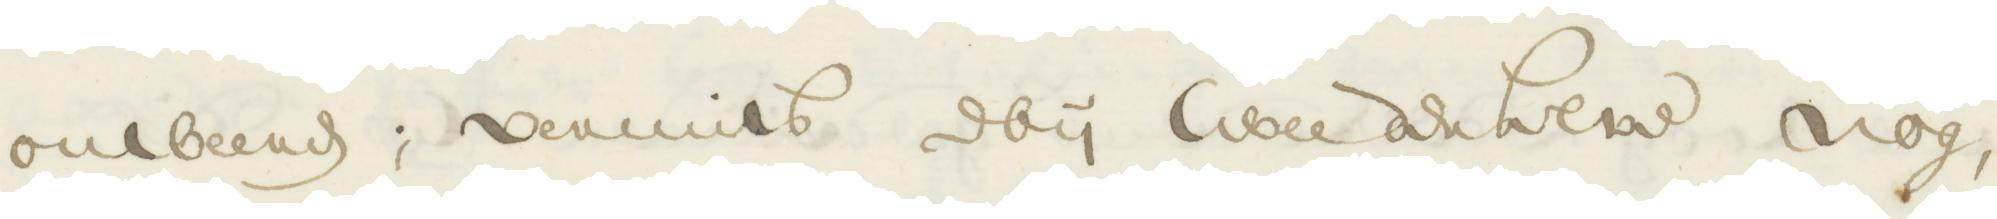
ontbeeren; vermits wij twee derselve nog,
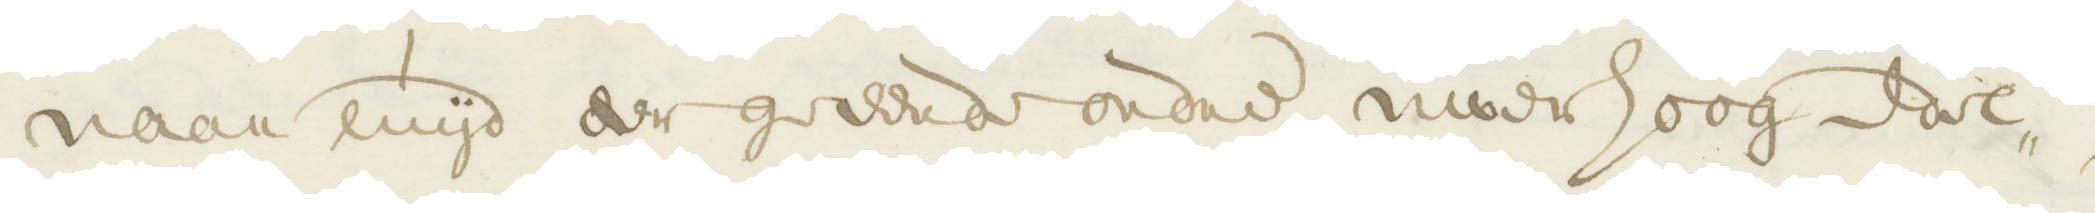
naar luijd der geeerde ordre uwer hoog Edel„
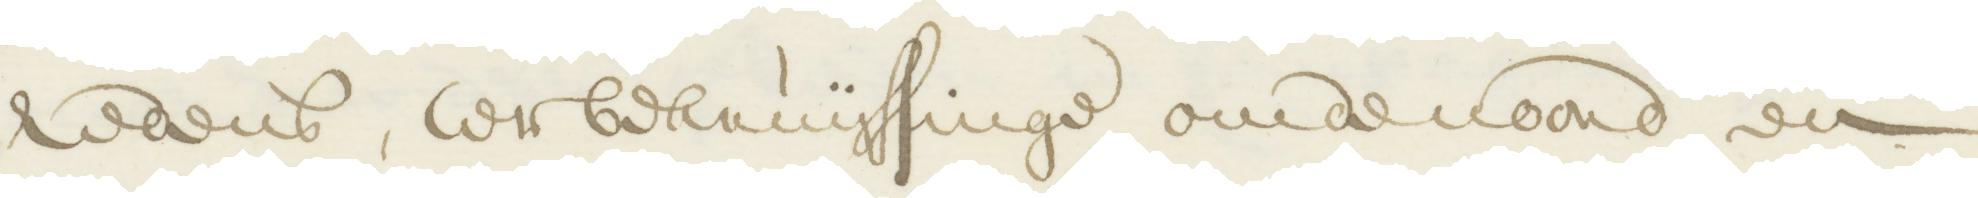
hedens, ter bekruijssinge om de noord en
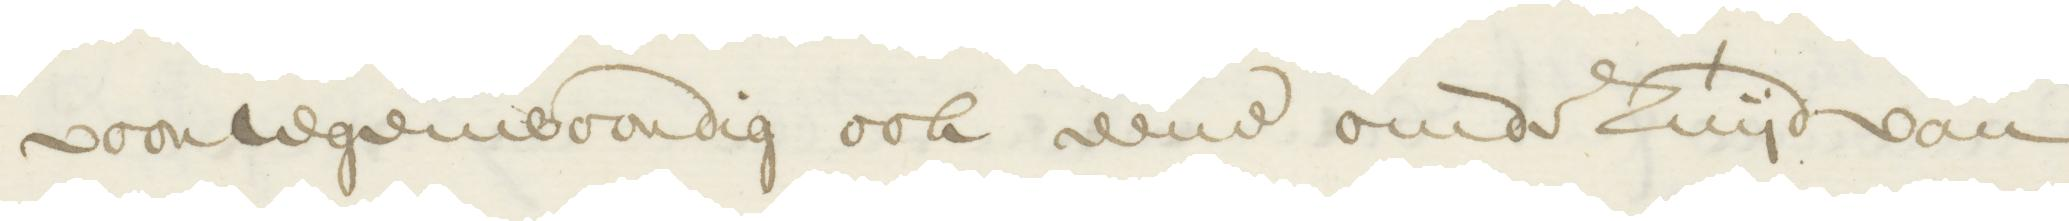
voor tegenwoordig ook eene omde zuijd van
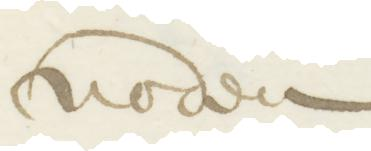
noden
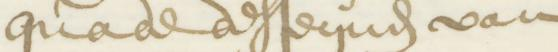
quade desseijnen van
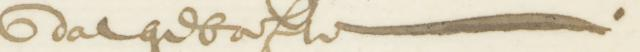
dat geboefte.
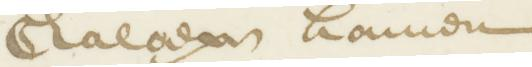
chaloepen konnen
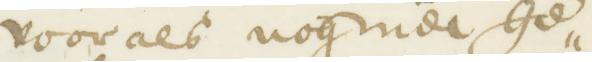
voor als nog niet ge„
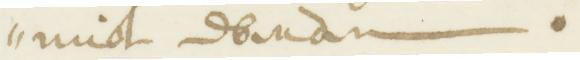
„mist werden.
